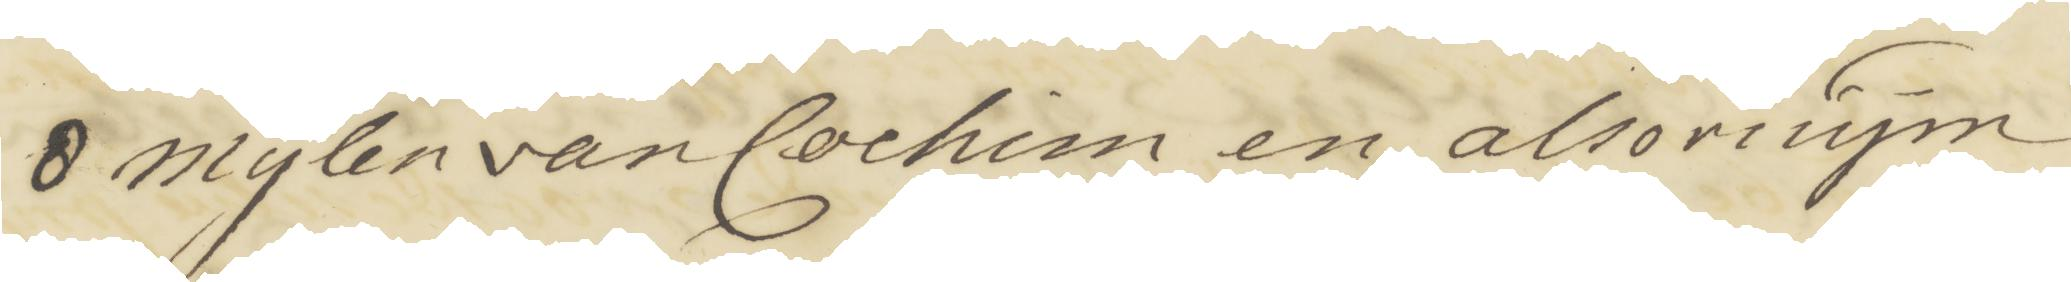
8 mijlen van Cochim en also ruijm
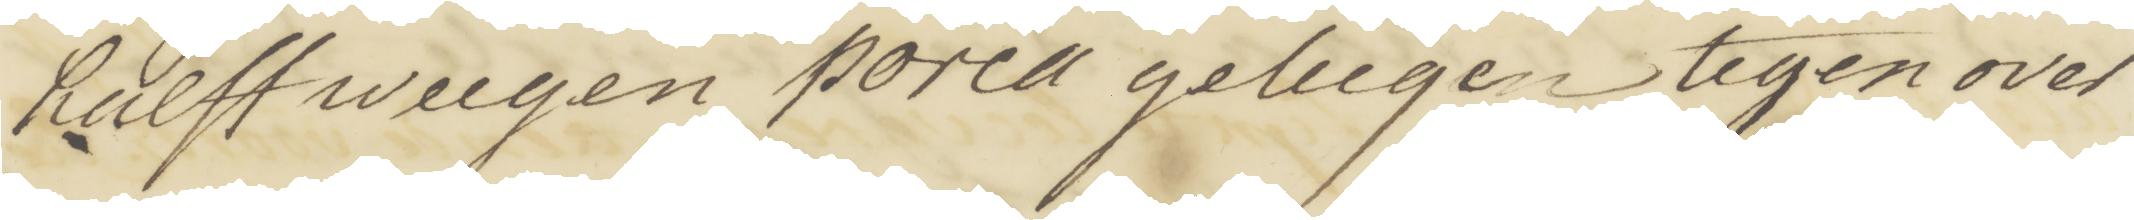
halff weegen porca geleegen tegen over
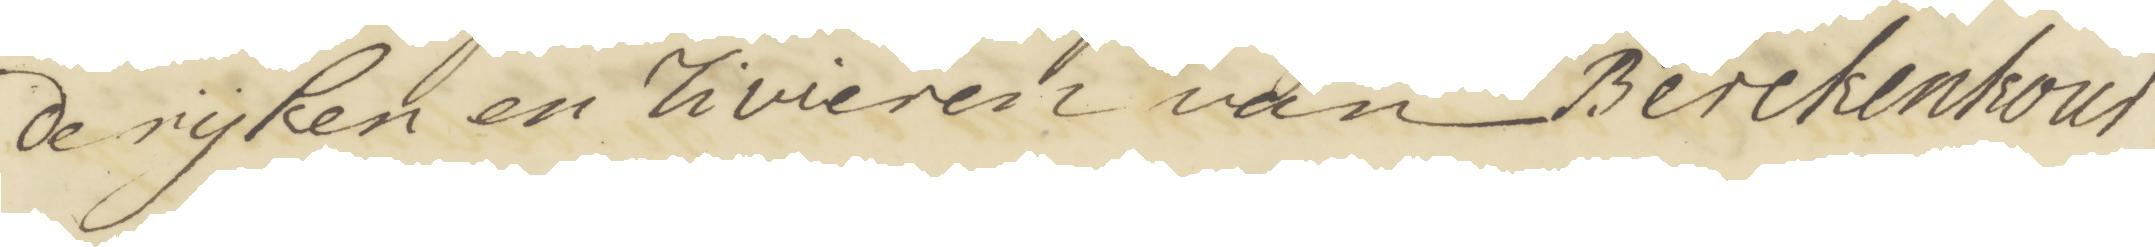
de rijken en rivieren van Berckenkour
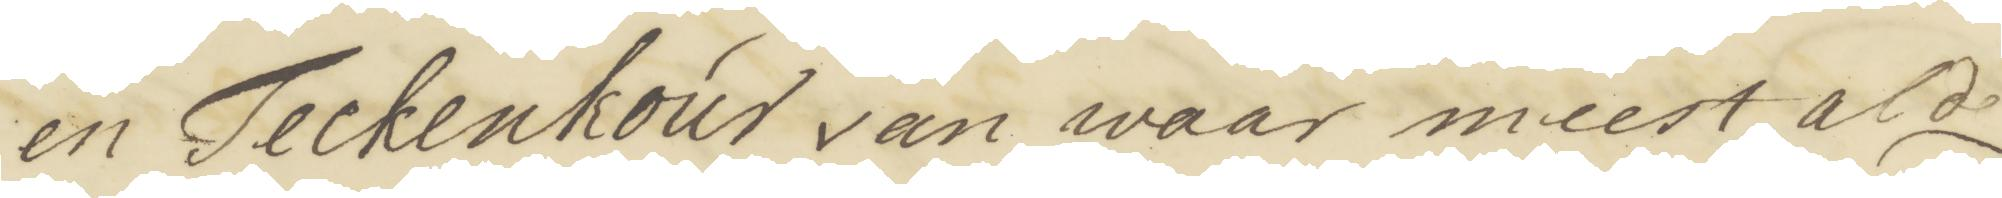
en Teckenkour van waar meest al de
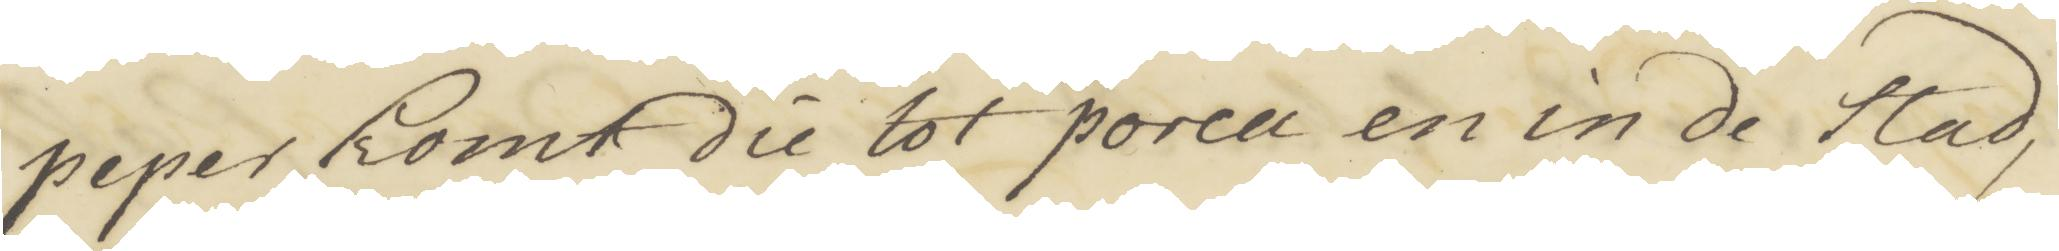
peper komt die tot porca en in de stad,
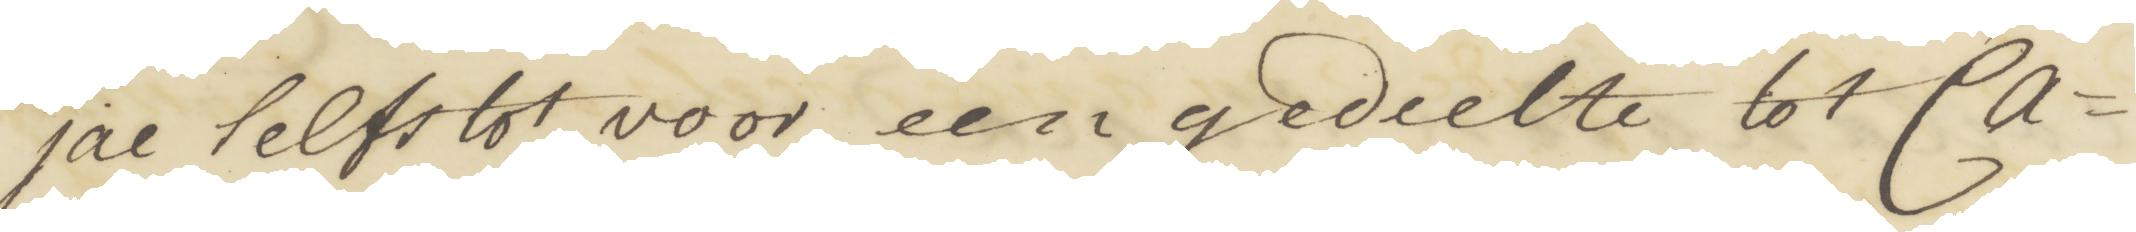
jae selfs tot voor een gedeelte tot Ca=
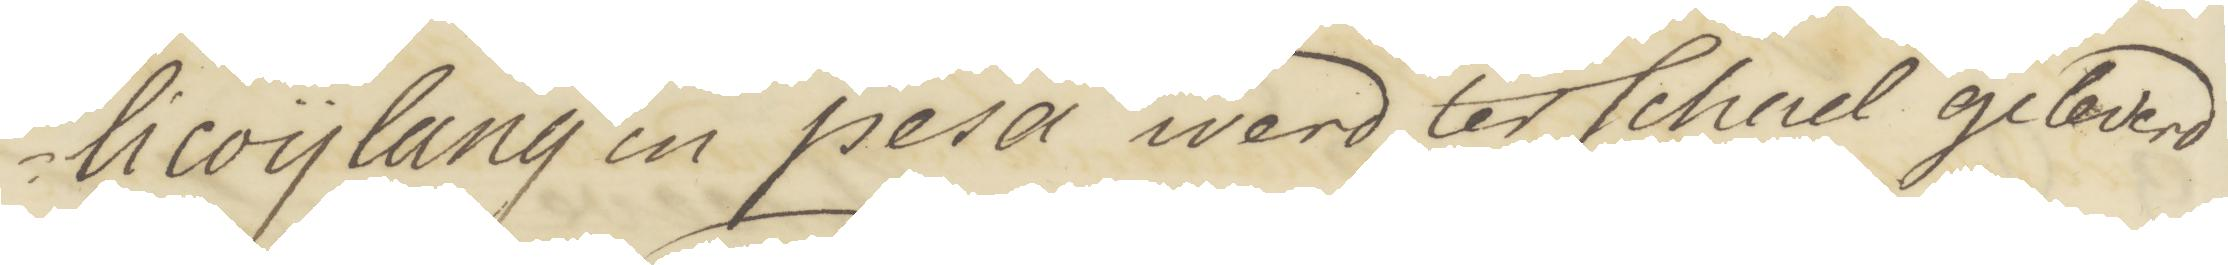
„licoijlang en pesa werd ter schael geleverd
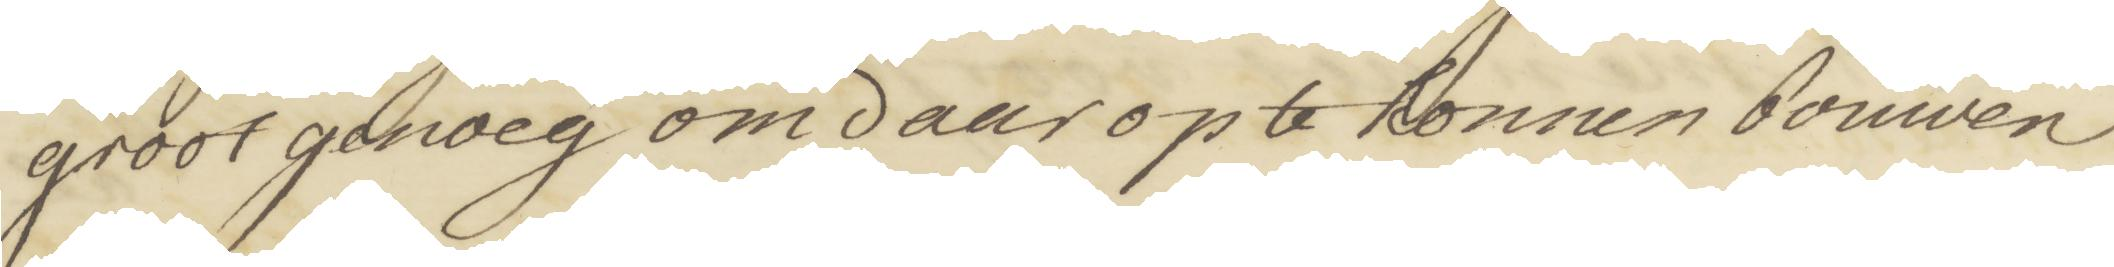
groot genoeg om daar op te konnen bouwen
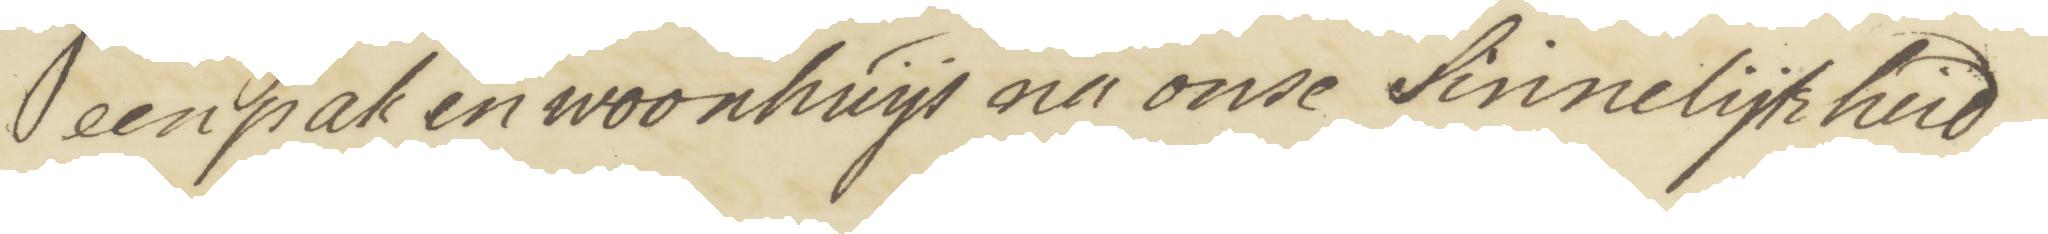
een pak en woonhuijs na onse sinnelijkheid
